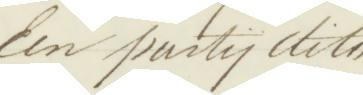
Een partij dito
